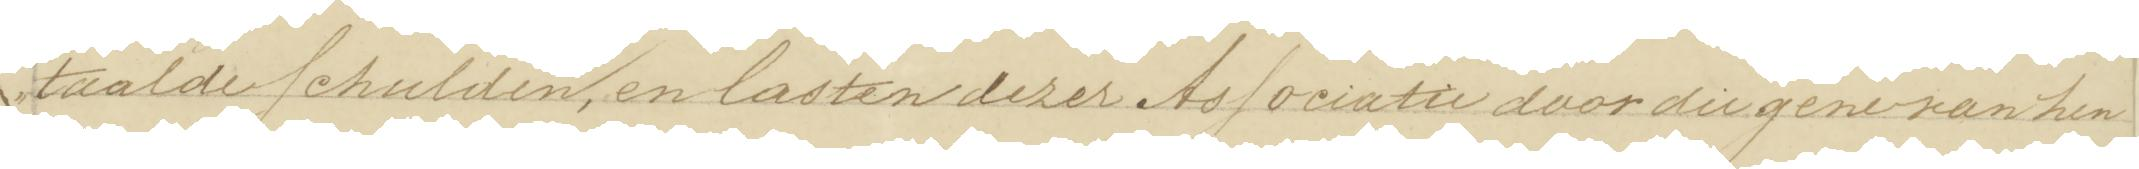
„taalde schulden, en lasten dezer Associatie door die gene van hen
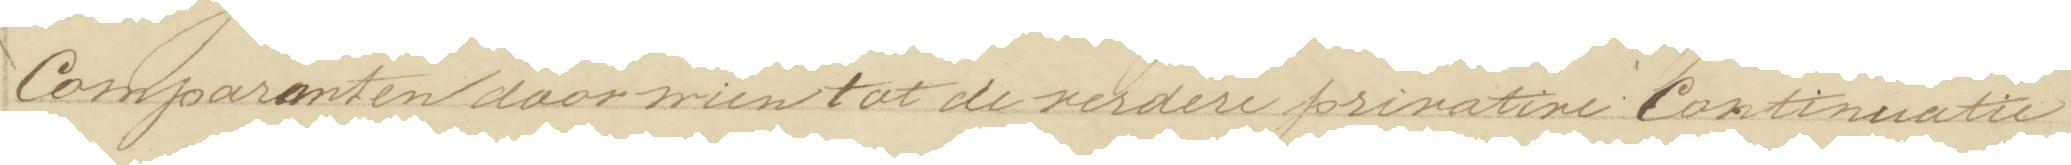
Comparanten door wien tot de verdere privative Continuatie
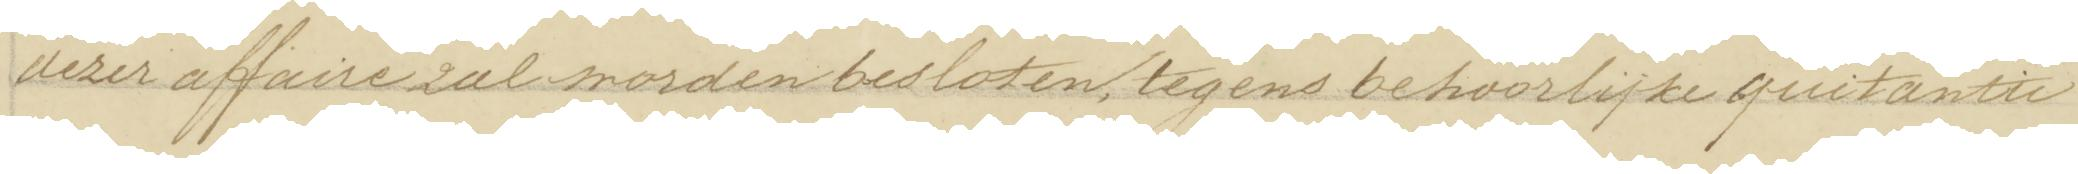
dezer affaire zal worden besloten, tegens behoorlijke quitantie
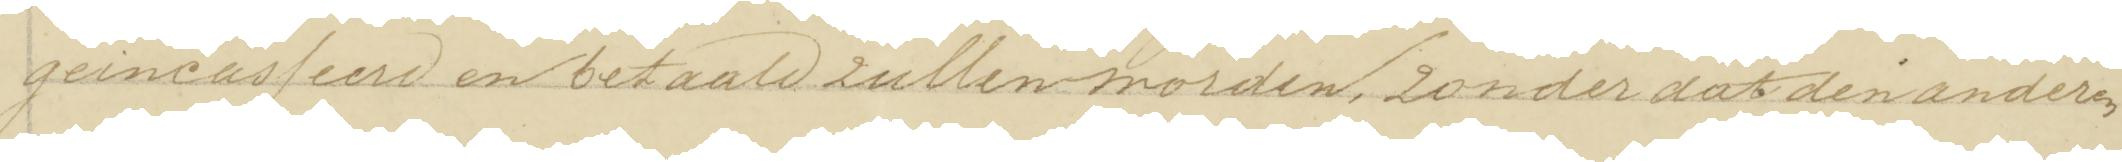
geincasseerd en betaald zullen worden, zonder dat den anderen
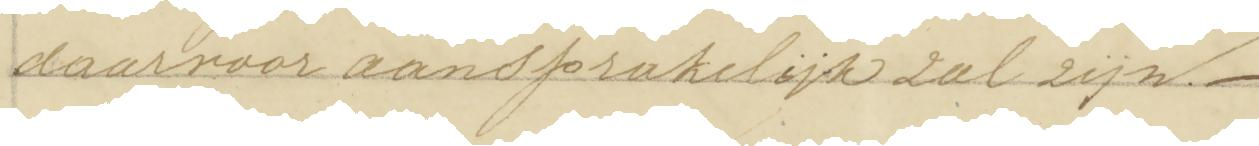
daarvoor aansprakelijk zal zijn.
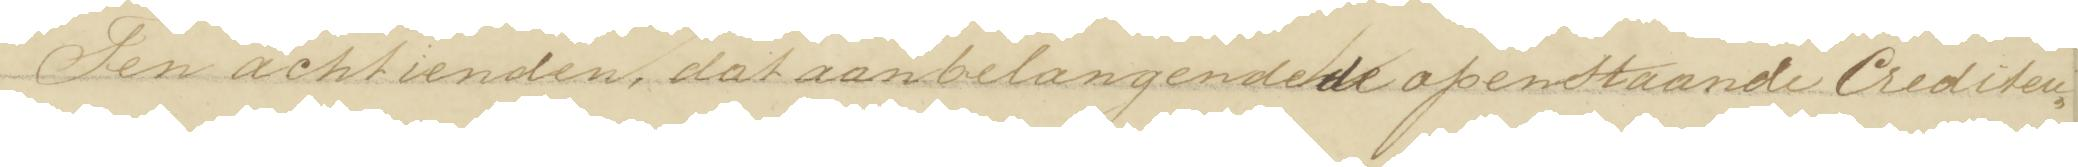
Ten achtienden, dat aan belangende de openstaande Crediteu„
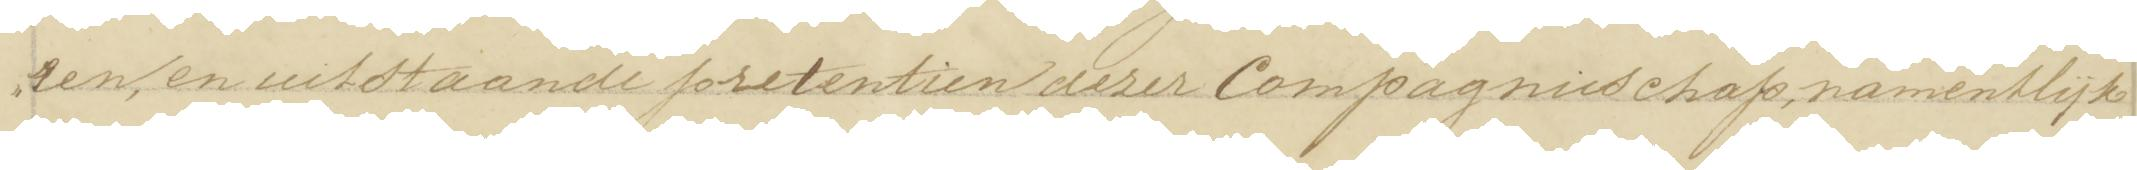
„ren, en uitstaande pretentien dezer Compagnieschap, namentlijk
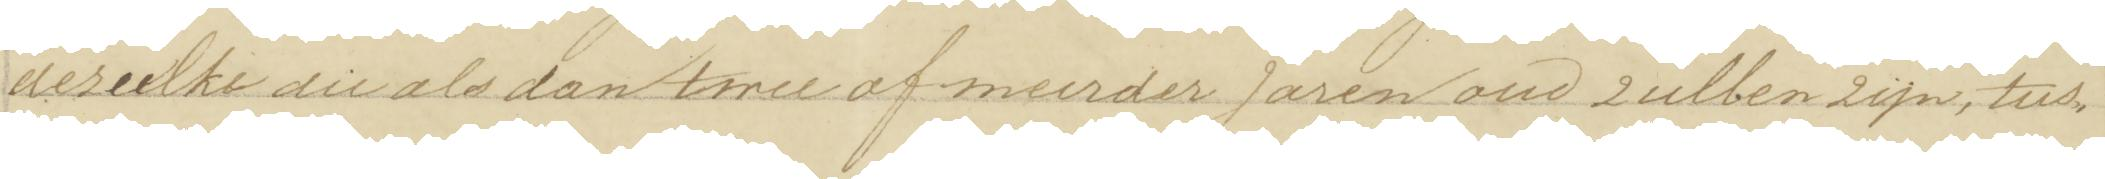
dezulke die als dan twee of meerder Jaren oud zullen zijn, tus„
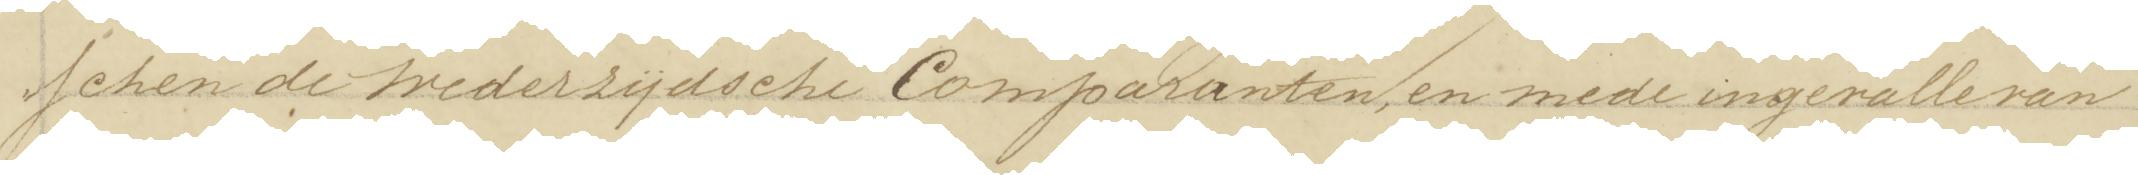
„schen de wederzijdsche Comparanten, en mede ingevalle van
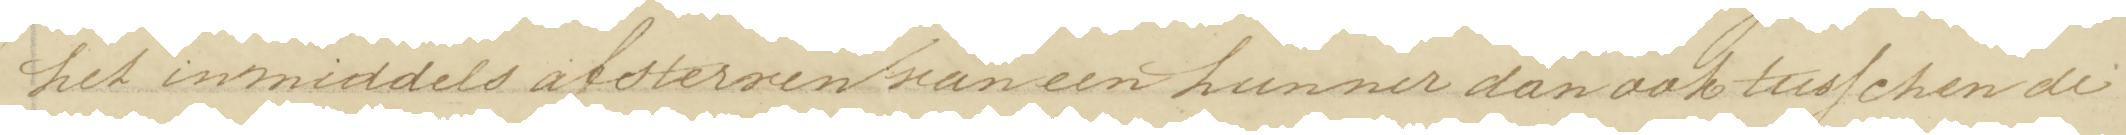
het inmiddels afsterven van een hunner dan ook tusschen de
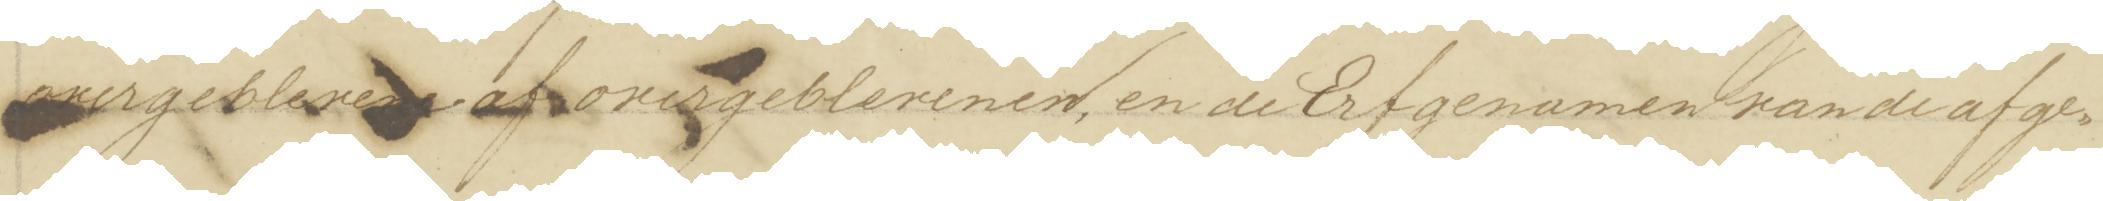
overgeblevene of overgeblevenen, en de Erfgenamen van de afge„
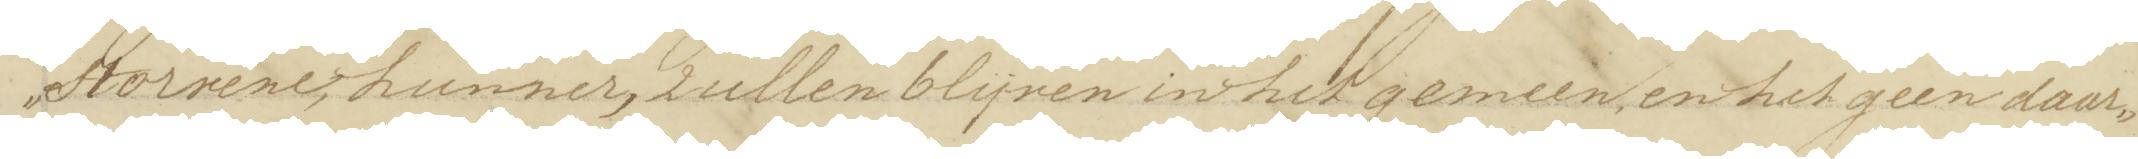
storvene, hunner, zullen blijven in het gemeen, en het geen daar„
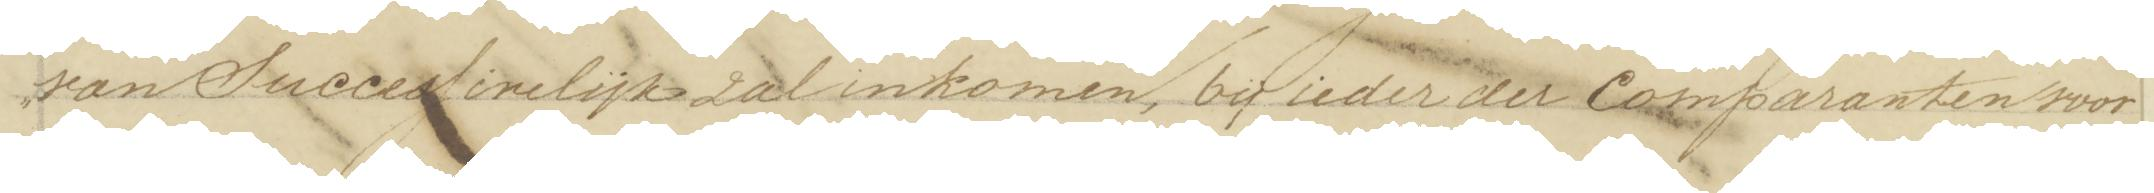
„van Successivelijk zal inkomen, bij ieder der comparanten voor
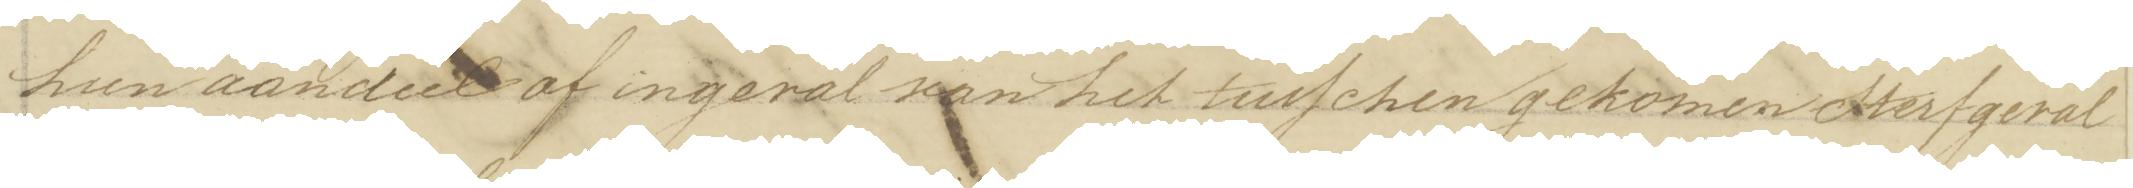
hun aandeel of ingeval van het tusschen gekomen sterfgeval
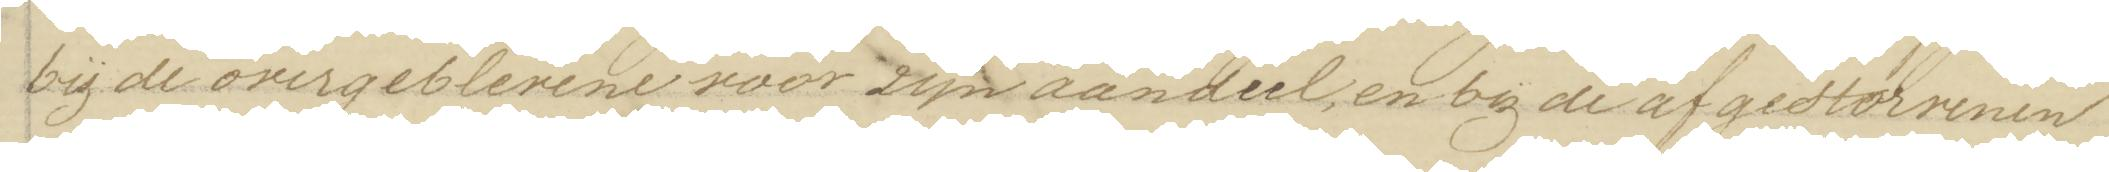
bij de overgeblevene voor zijn aandeel, en bij de afgestorvenen
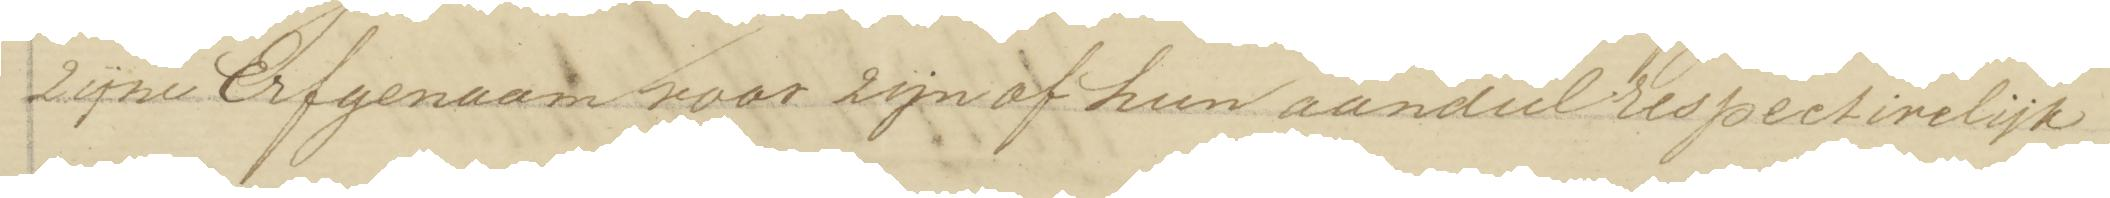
zijne Erfgenaam door zijn of hun aandeel respectivelijk
